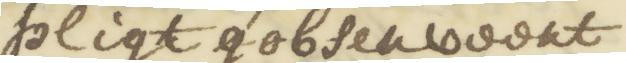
pligt g’observeert
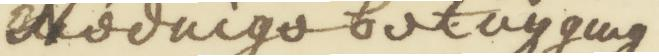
Nedrige betuijging
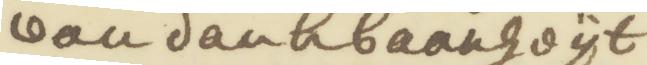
van dankbaarheijt
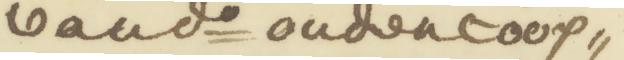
van d=o ondercoop„
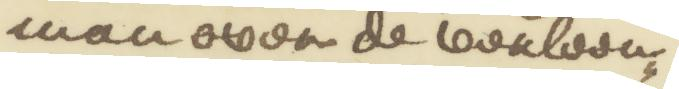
man over de verleen„
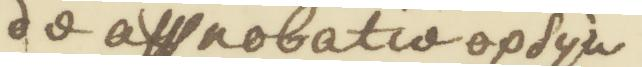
de approbatie op sijn
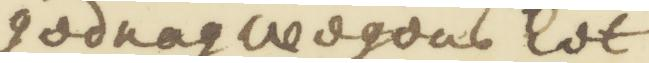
gedrag wegens het
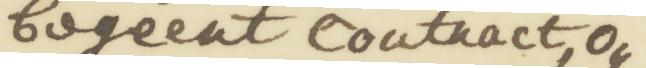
begeert contract, o
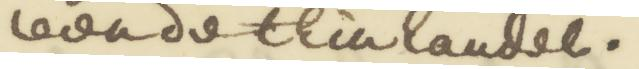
ver de thin handel.
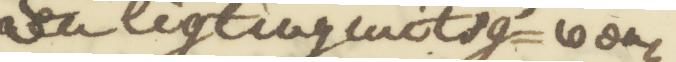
En ligting mitsg=s ver
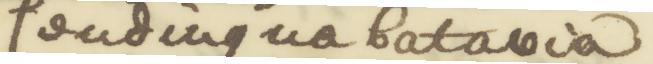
sending na batavia
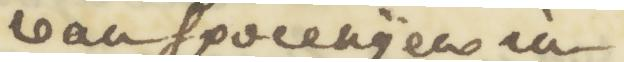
van specerijen in
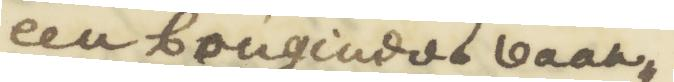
een bouginees vaar„
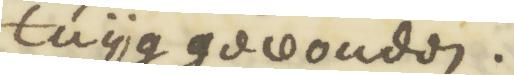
tuijg gevonden.
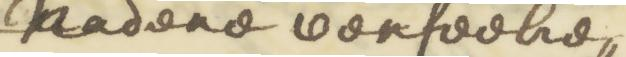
Nadere verseeke„
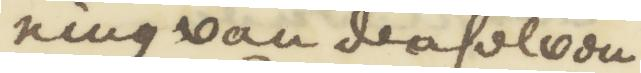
ring van denselven
